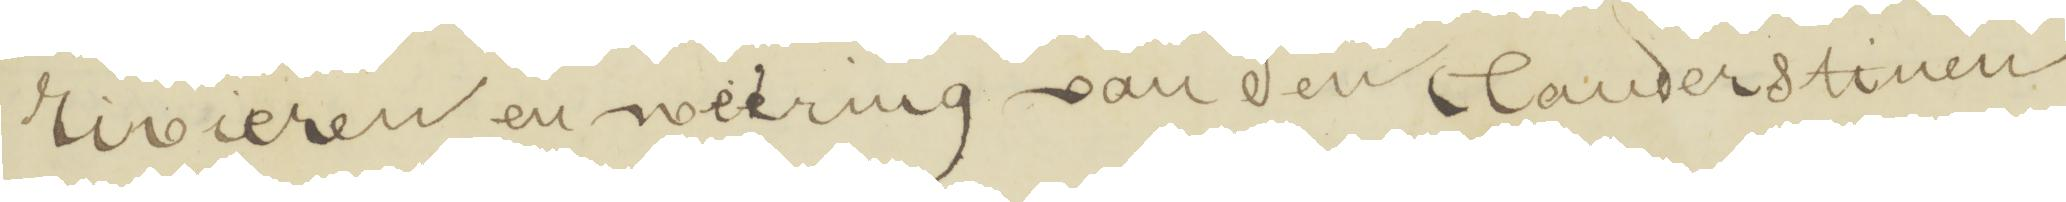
rivieren en weering van den clanderstinen
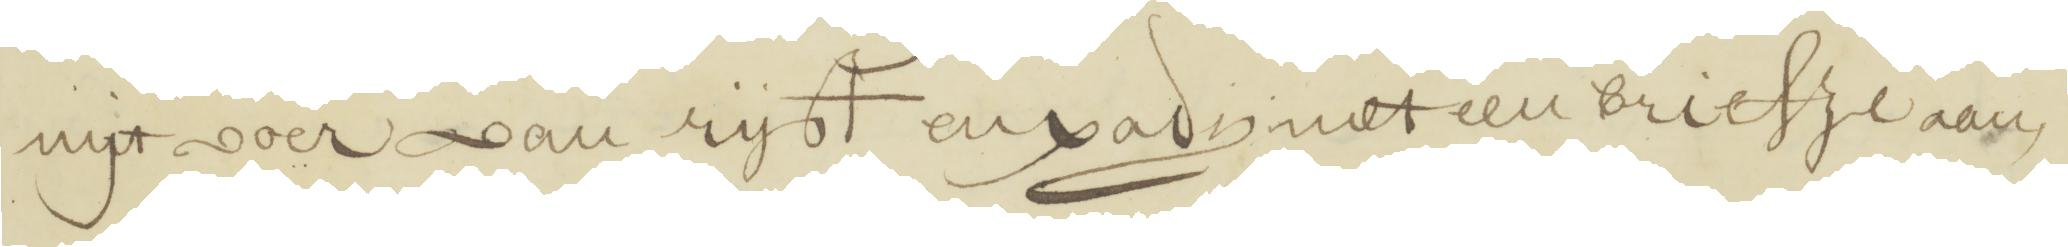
uijt voer van rijst en padij met een briefje aan
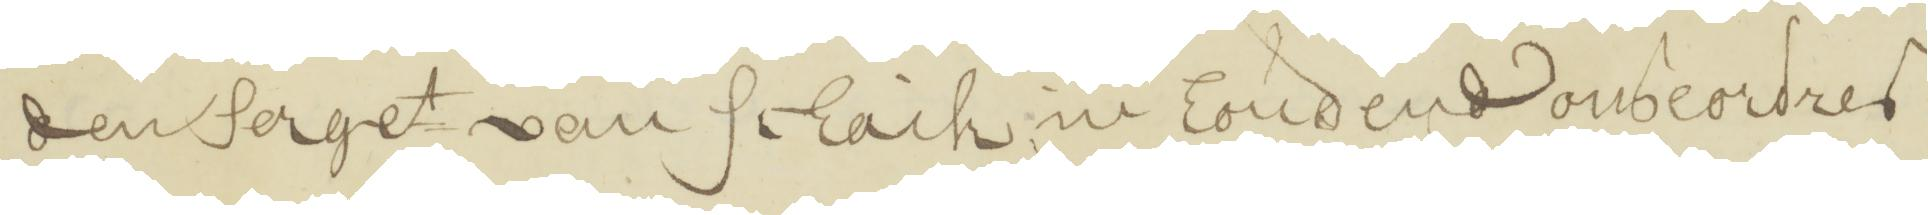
den serge=t van schaik in houdende onse ordres
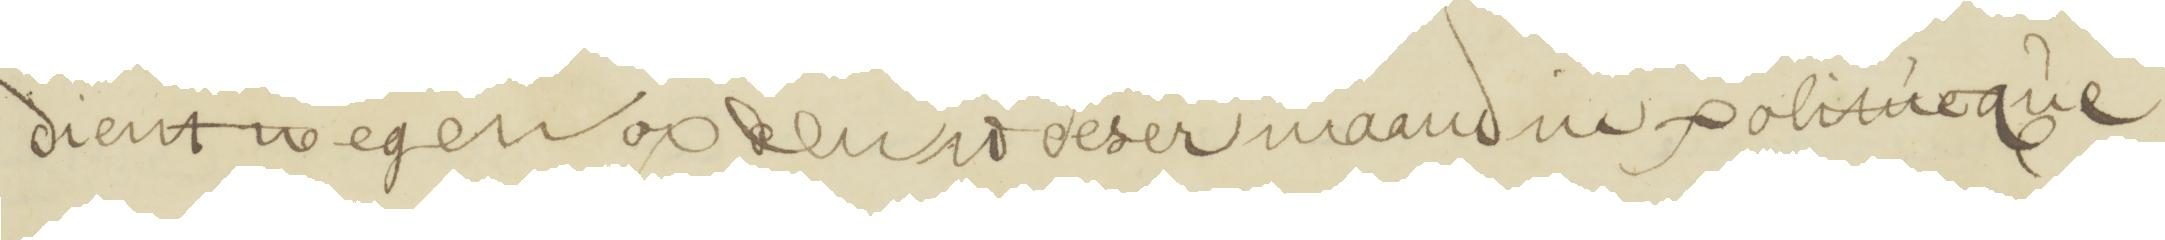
dient wegen op den 10 deser maand in politucque
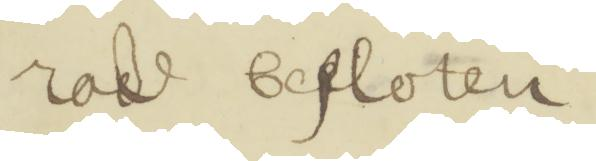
rade besloten
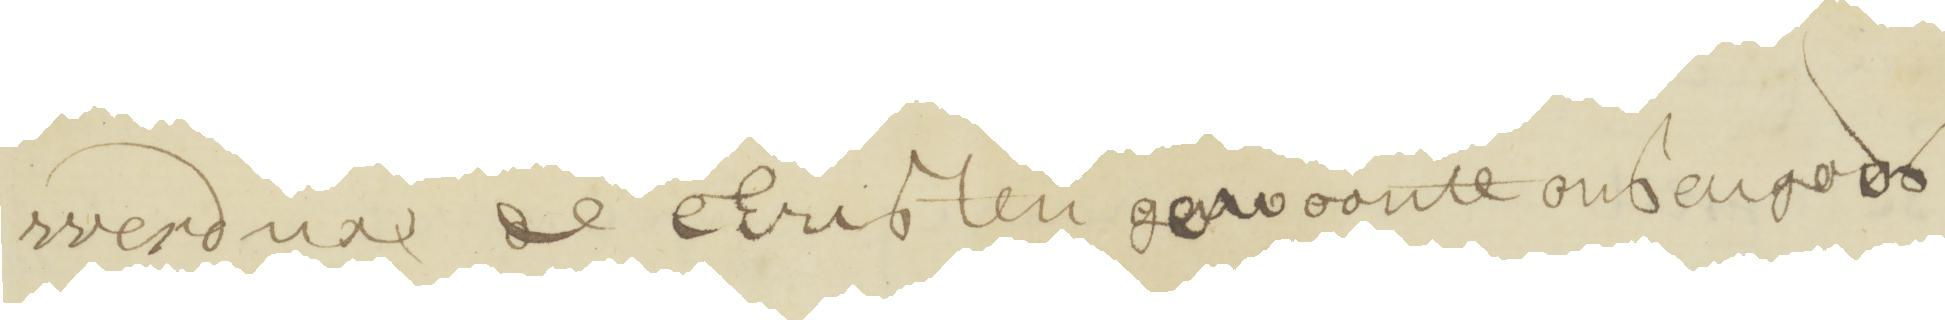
werd na de christen gewoonte onsengods
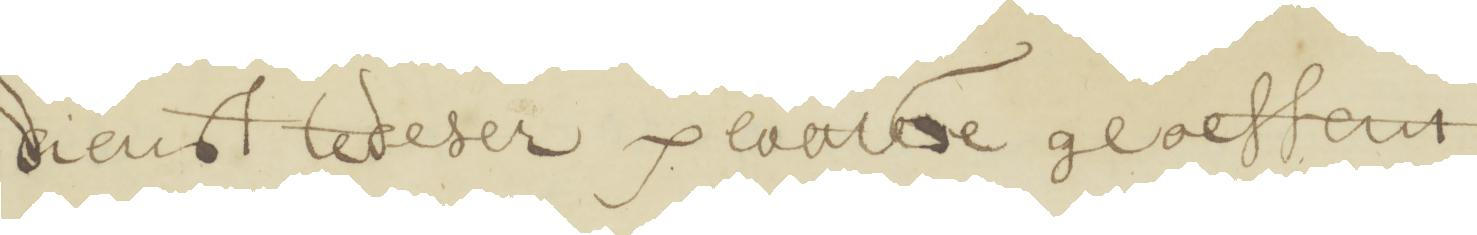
dienst tedeser plaatse geoeffent
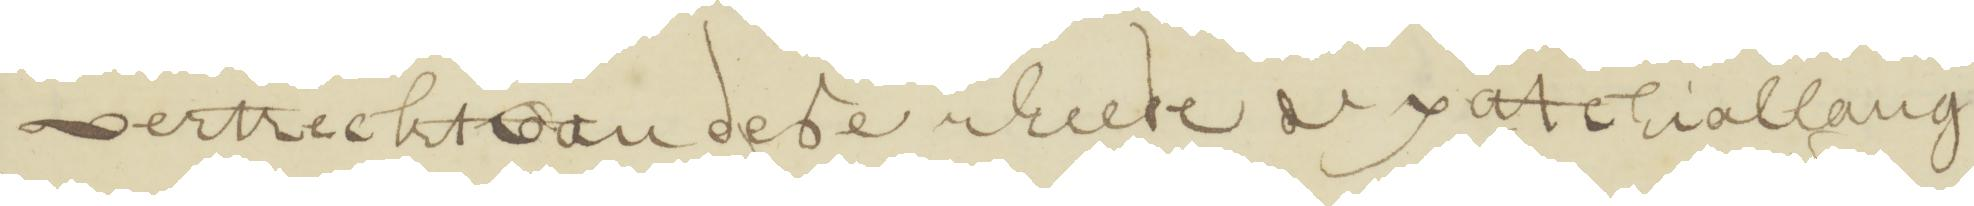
vertreckt van dese rheede de patchiallang
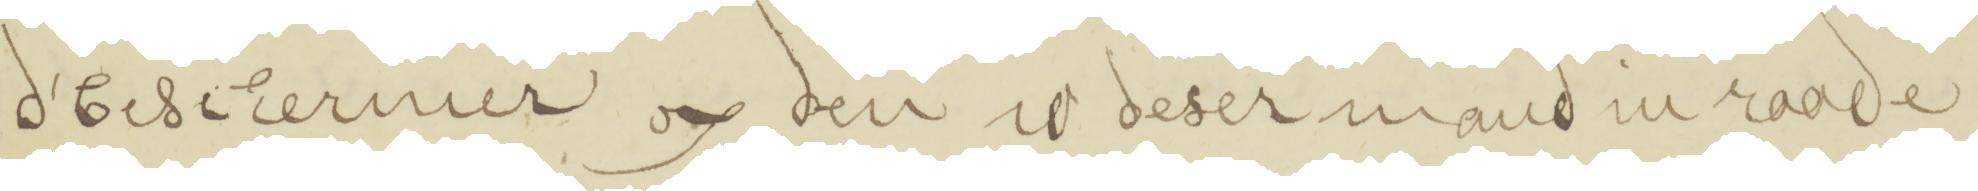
d’ beschermer op den 10 deser mand in raade
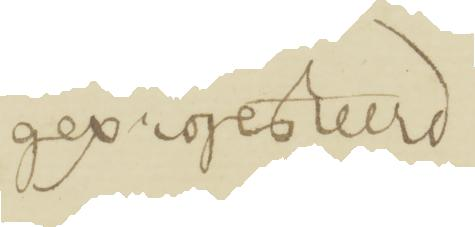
geprojesteerd
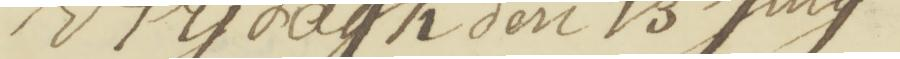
vrijdagh den 13 Junij
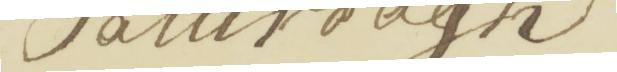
saturdagh
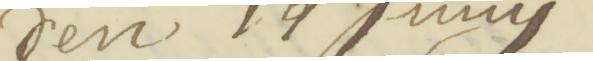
den 14 Junij
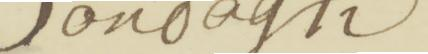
sondagh
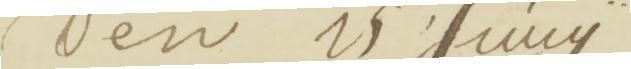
den 15 Junij
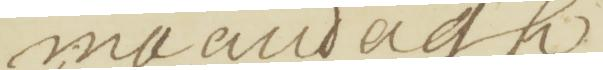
maandagh
